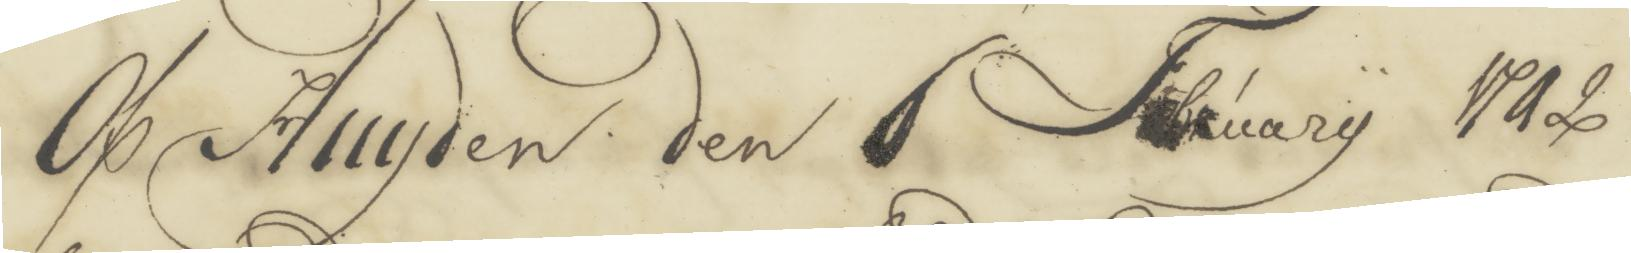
Op Huyden den 6 Febuarij 1742
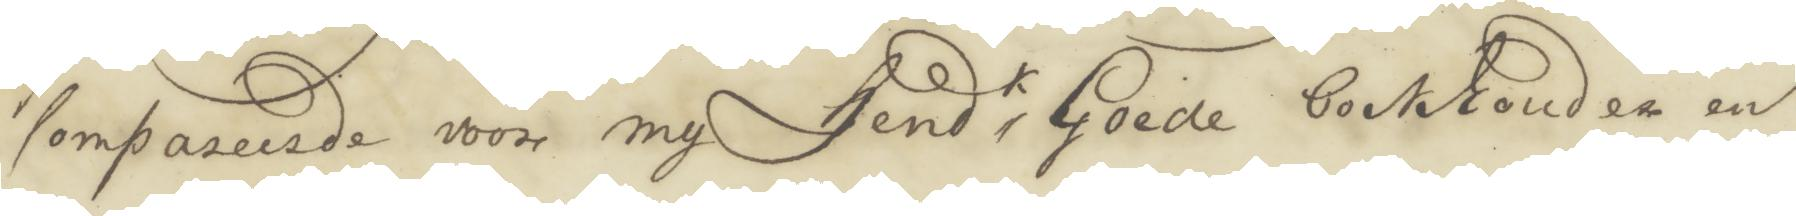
Comparende voor my Hend„k Goede boekhouder en
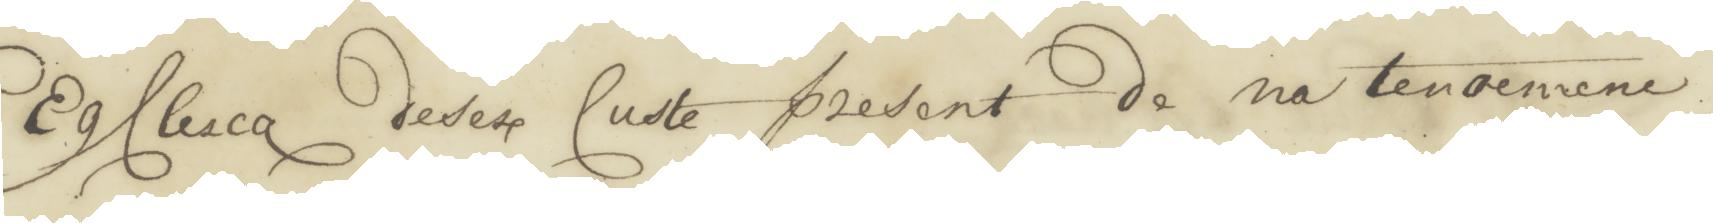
'Eg clercq deser Custe present de na te noemene
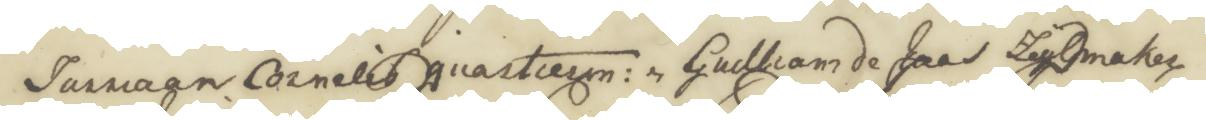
Iurriaan Cornelis quartierm: en Guilham de Faas zeijlmaker
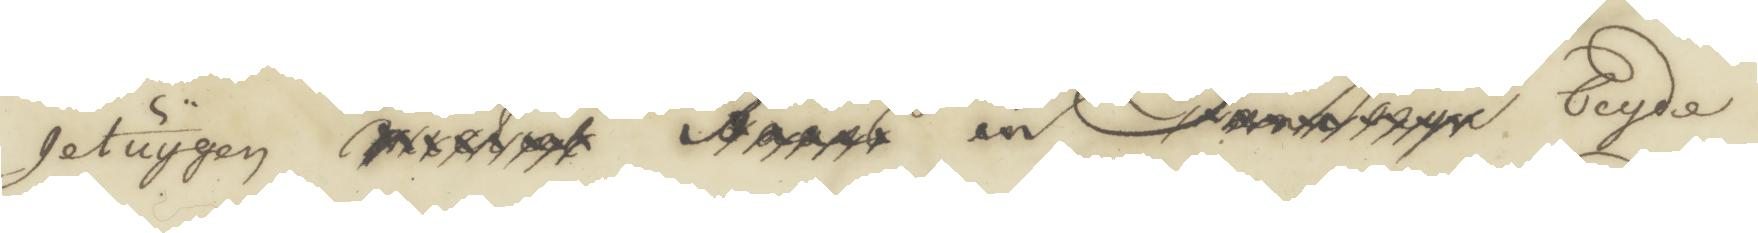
getuijgen nrarigt saann in aresyne beyde
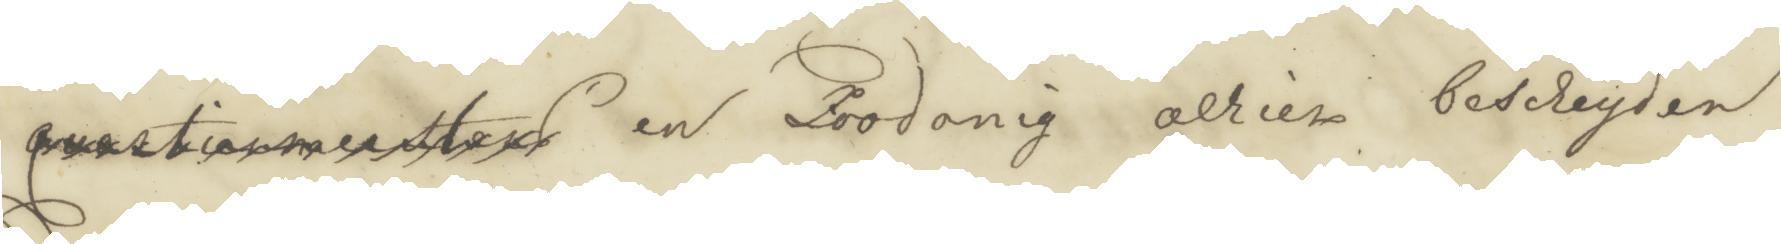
quartiermeesters en Zoodonig alhier bescheijden
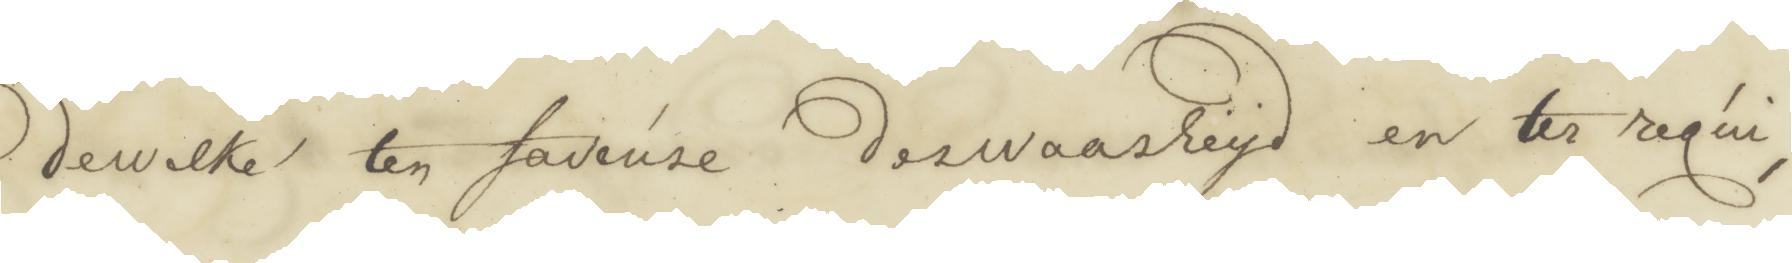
dewelke ten faveure der waarheijd en ter requi
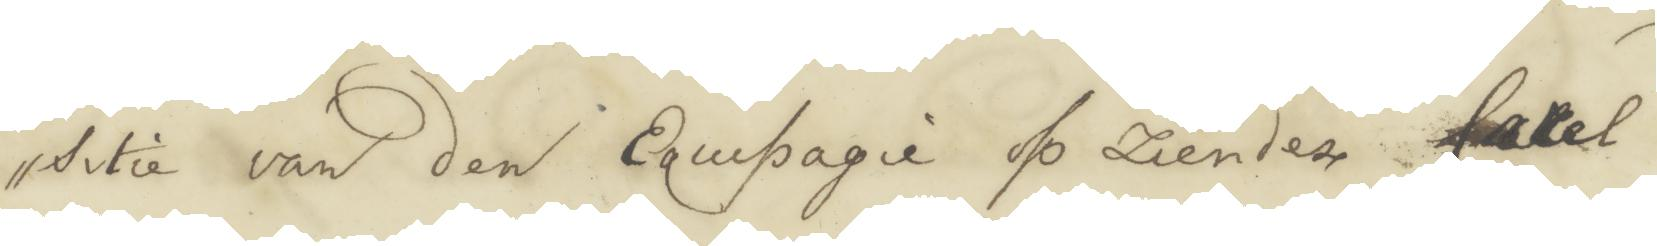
„sitie van den Equipagie op ziender Carel
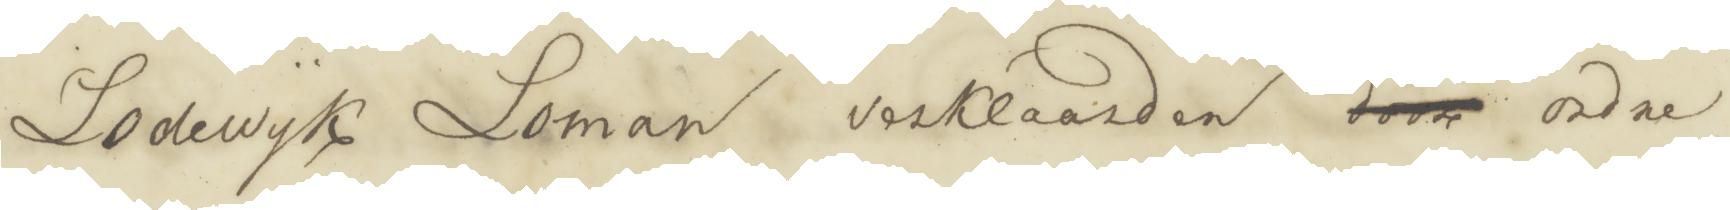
Lodewijk Loman verklaarden door ordre
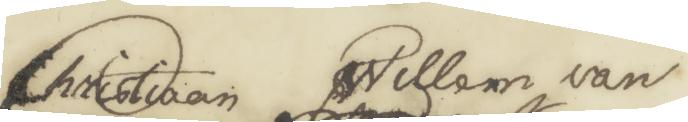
Christiaan willem van
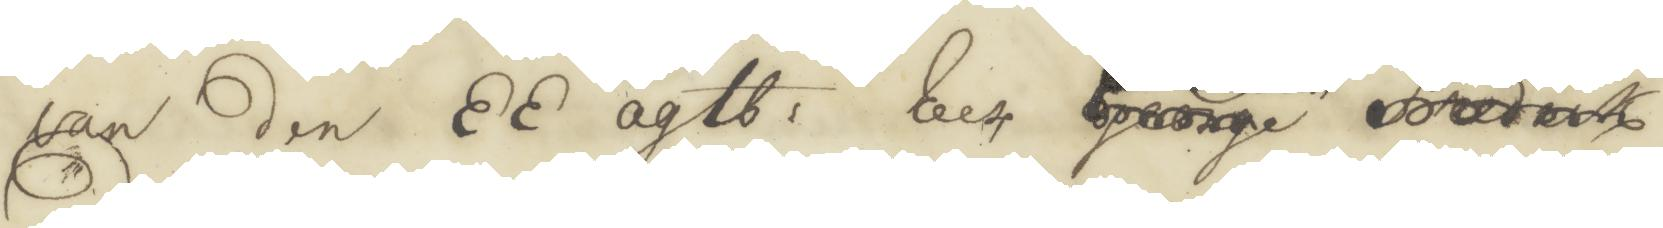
van den EE agtb: heer george Frederik
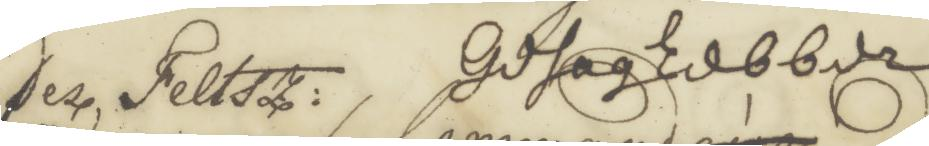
der Feltsz: gesaghebber
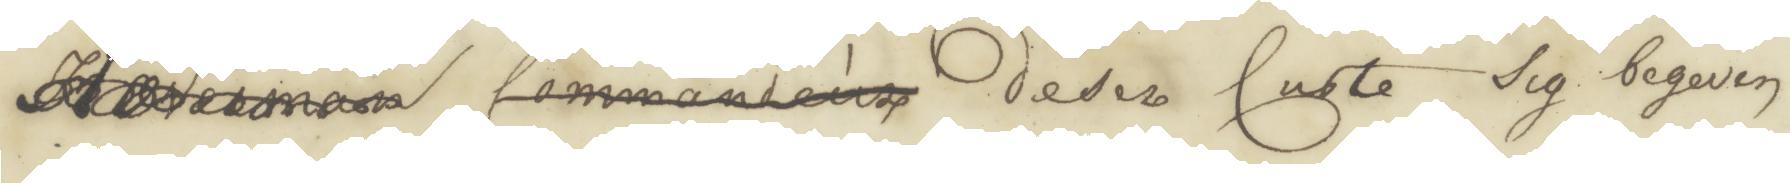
Hedderman Commandeur deser Custe sig begeven
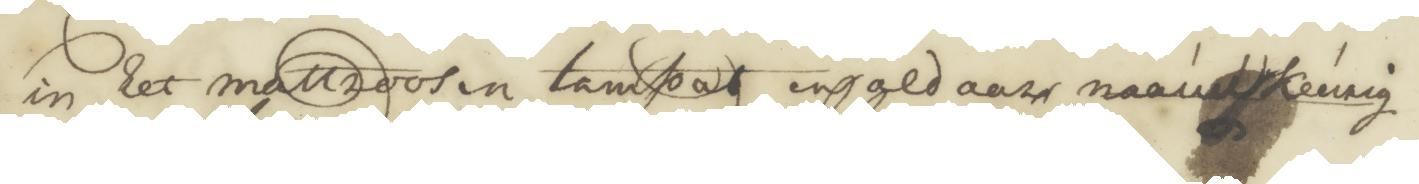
in het mattzoosen tampat en aldaar naauwkeurig
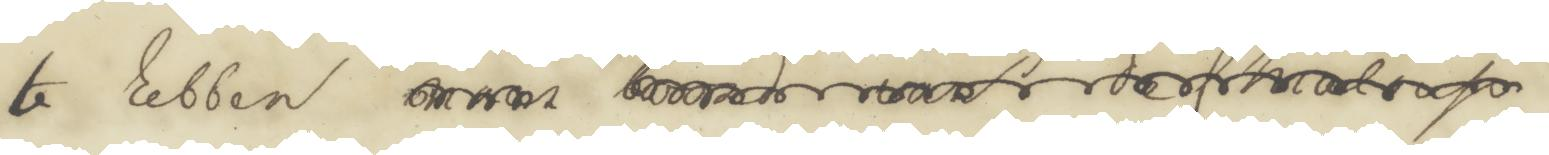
te hebben omme bevrnds warr matrosen
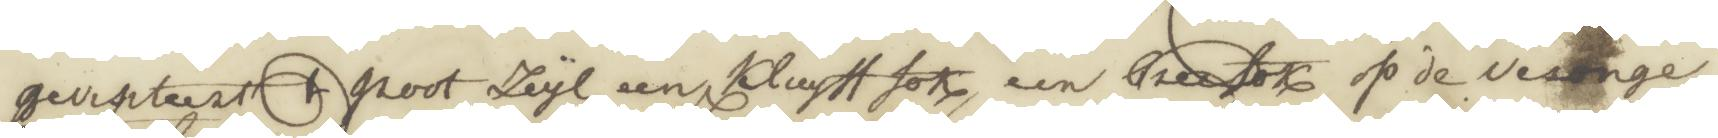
gevisiteert t groot zeijl een kluitt fok een breefok op de veronge
